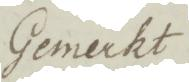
Gemerkt
